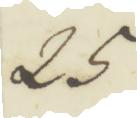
25
